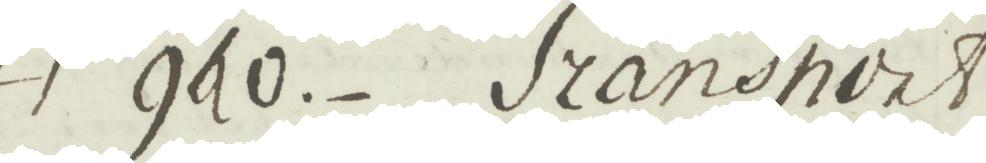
N 940.- Transport
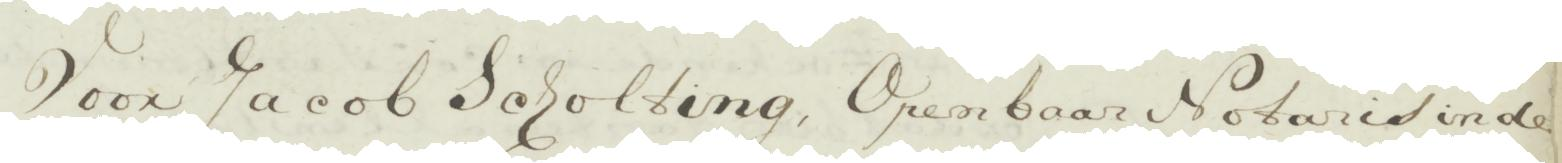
Voor Jacob Scholting, Openbaar Notaris in de
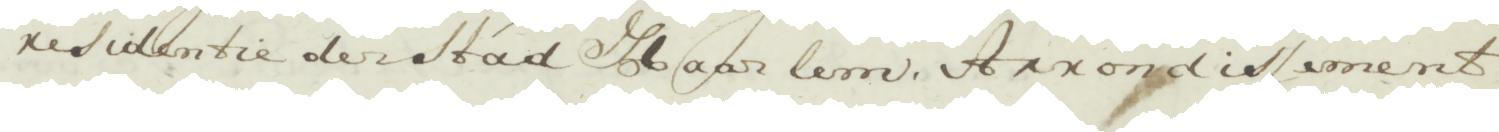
residentie der stad Haarlem, Arrondissement
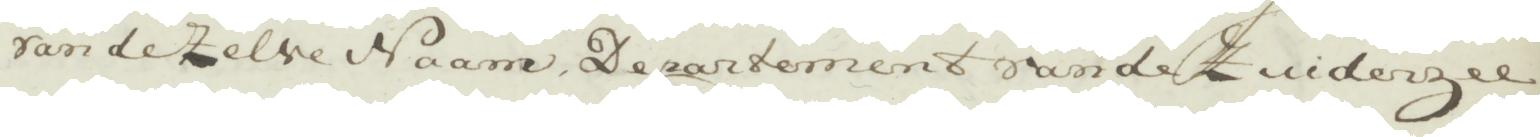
van dezelve Naam, Departement van de Zuiderzee
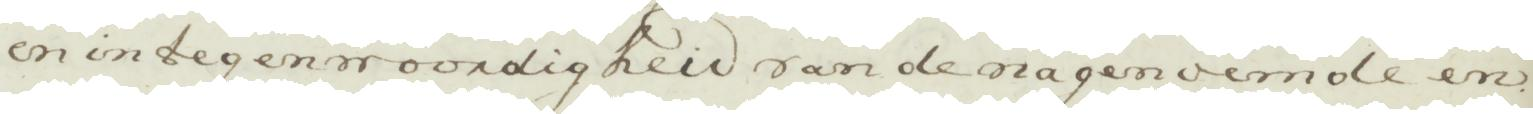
en in tegenwoordigheid van de nagenoemde en
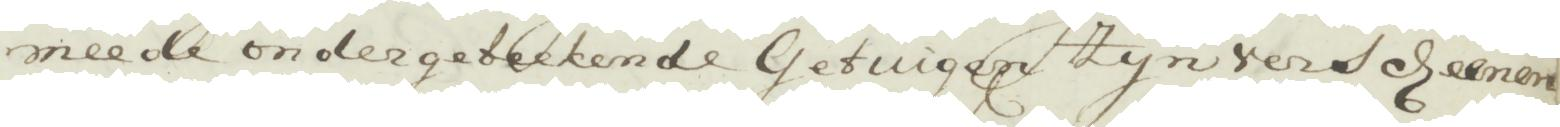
meede ondergebeekende Getuigen zijn verscheenen
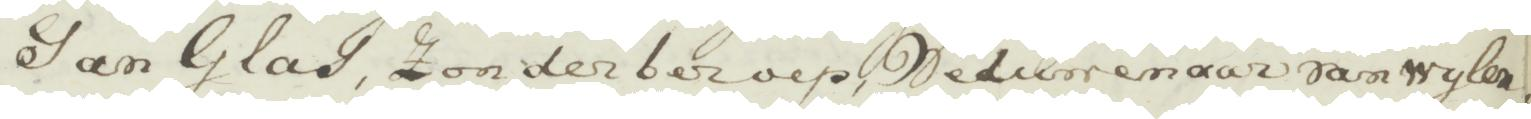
Jan Glas, Zonder beroep, Weduwenaar van wylen
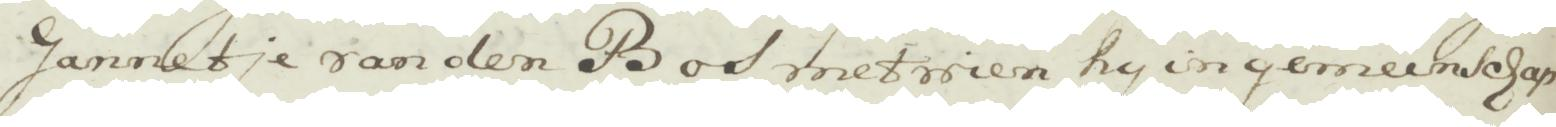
Jannetje van den Bos, met wien hij in gemeenschap
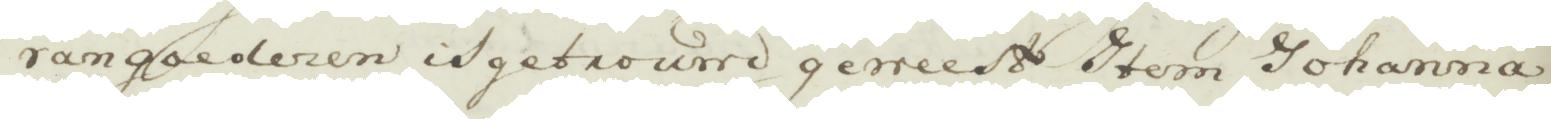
van goederen is getrouwd geweest Item Johanna
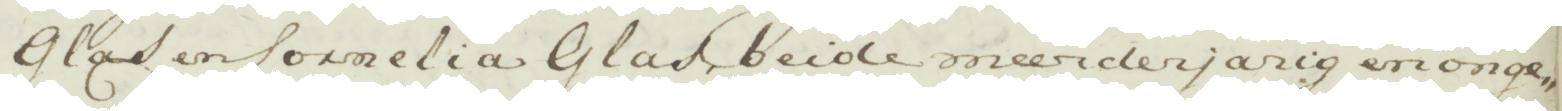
Glas en Cornelia Glas, beide meerderjarig en onge„
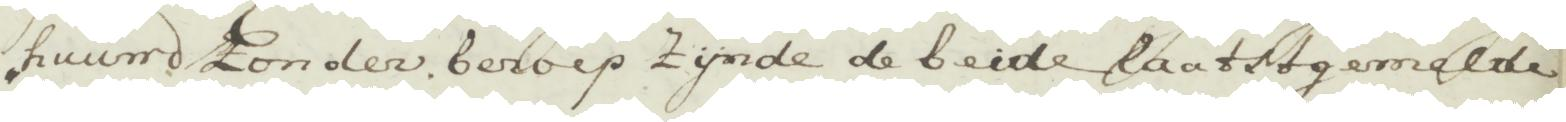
„huuwd zonder beroep zijnde de beide laatstgemelde
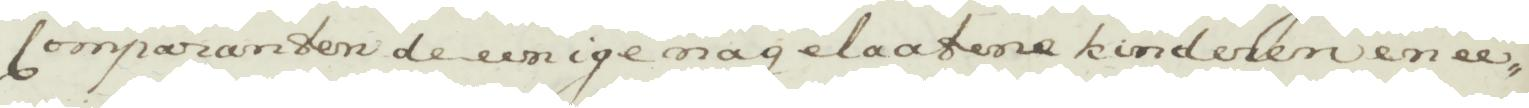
comparanten de eenige nagelaatene kindelen en ee„
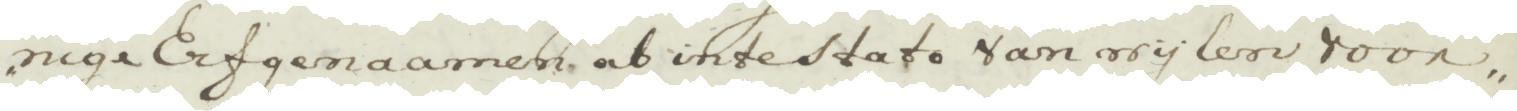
„nige Erfgenaamen ab in testato van wijlen voor„
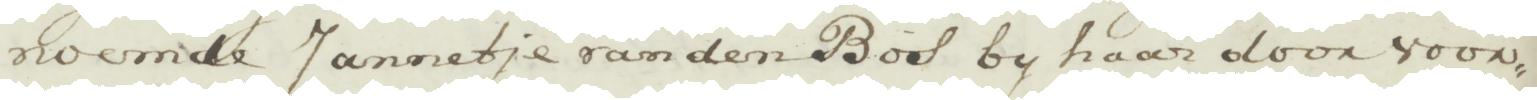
noemde Jannetje van den Bos by haar door voor„
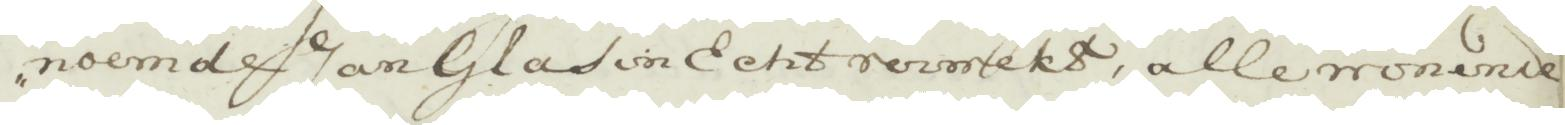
„noemde Jan Glas in Echt verwekt, alle wonende
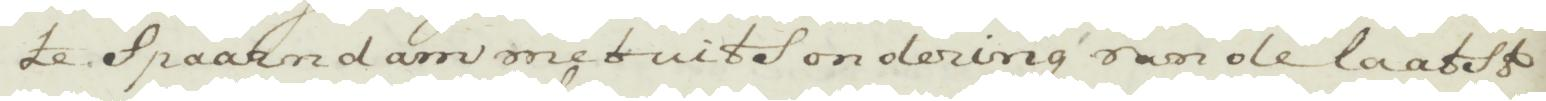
te spaarndam met uitsondering van de laatst
